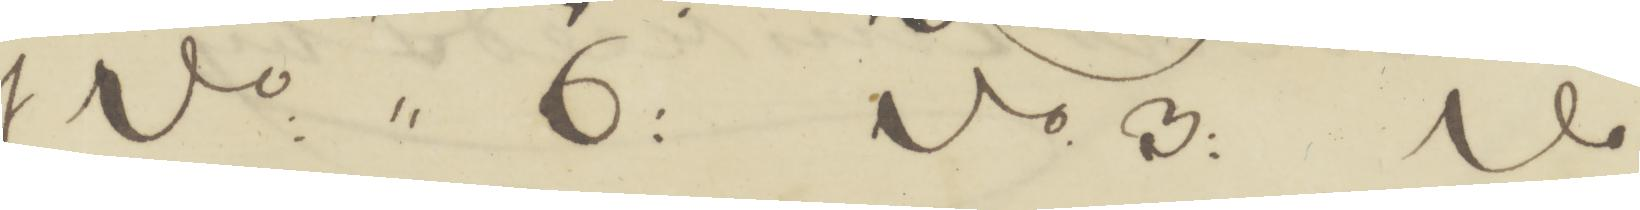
1 D:o „ 6: D:o 3: Do
